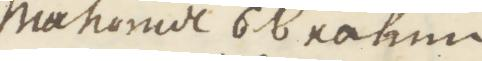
Mahomet Ebrahim
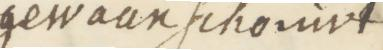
gewaarschouwt
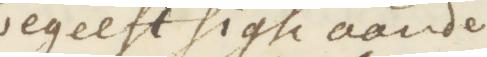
begeeft sigh aan de
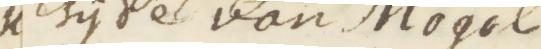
sijde van Mogol
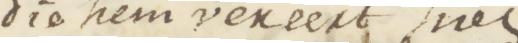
die hem vereert met
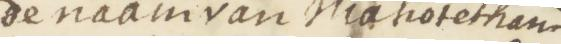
de naam van Mahotethan
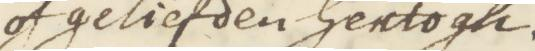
of geliefden hertogh
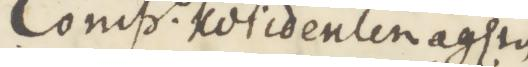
Comp.s residenten aghten
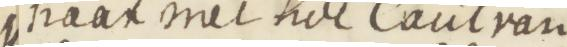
haar met het Caul van
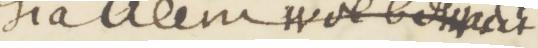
sia Alem wel bewaert
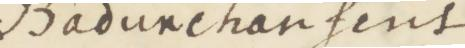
Badurchan fens
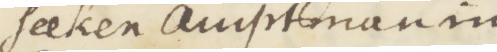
seeken amptman in
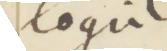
logie
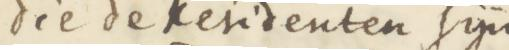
die de residenten sijn
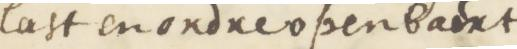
last en ordre openbaert
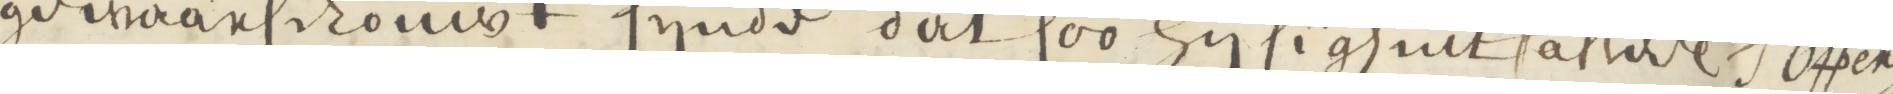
gewaarschouwt sijnde dat soo hij sigh int Castele
